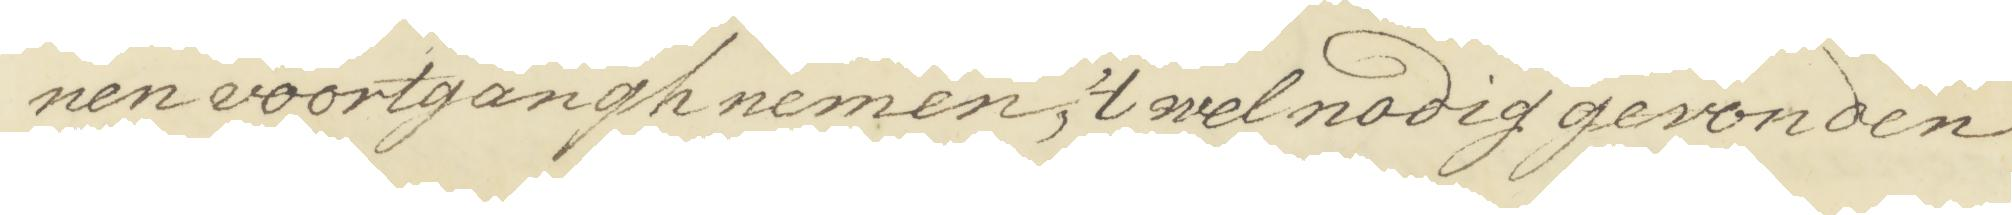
nen voortgangh nemen, ’t wel nodig gevonden
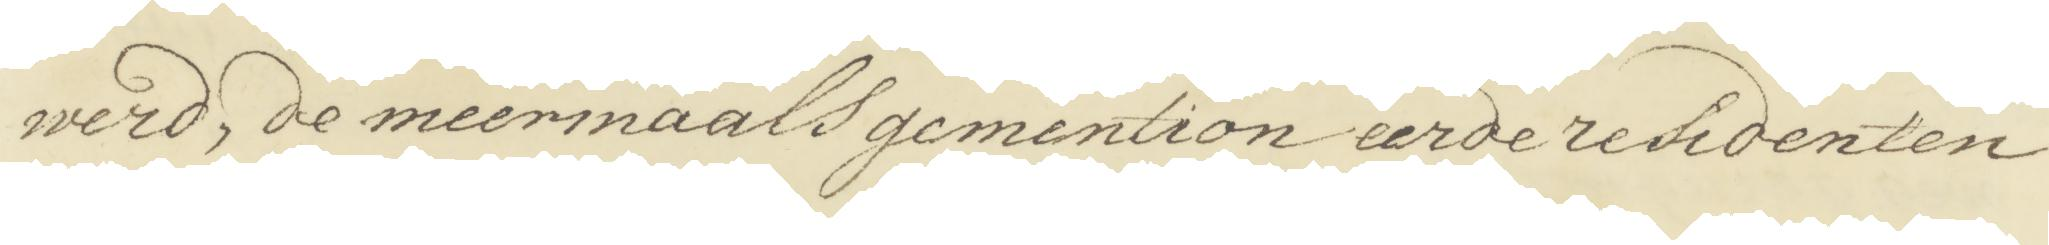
werd, de meermaals gemention eerde residenten
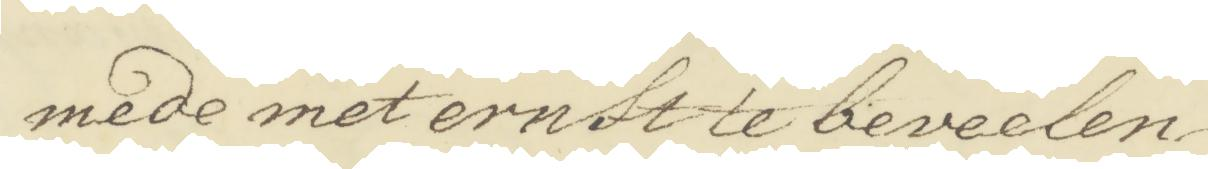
mede met ernst te beveelen —
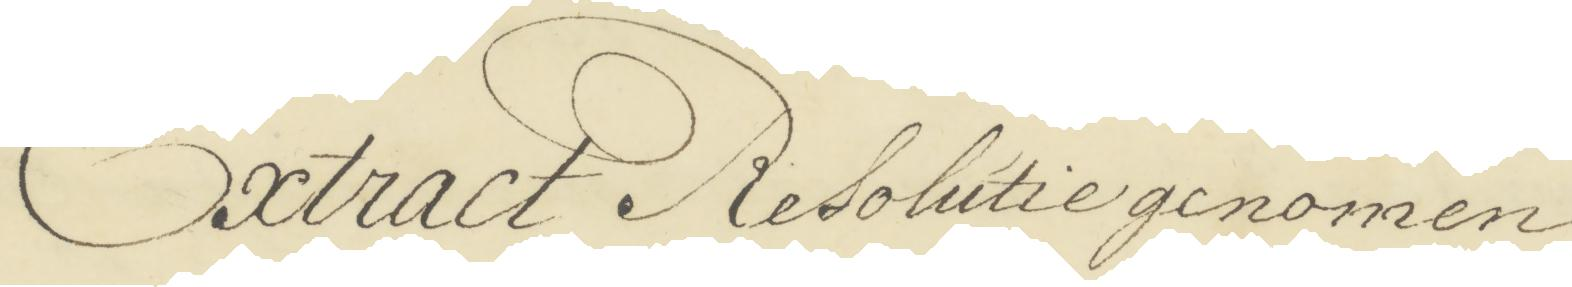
Extract Resolutie genomen
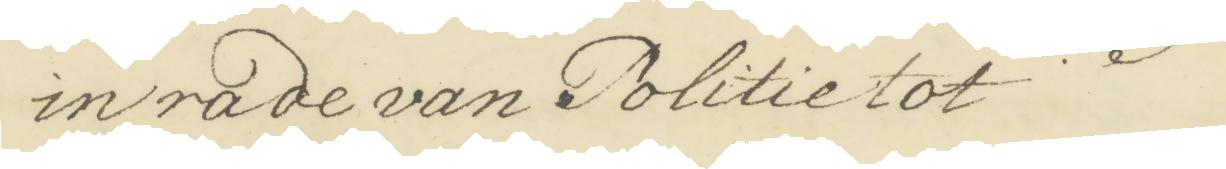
in rade van Politie tot e
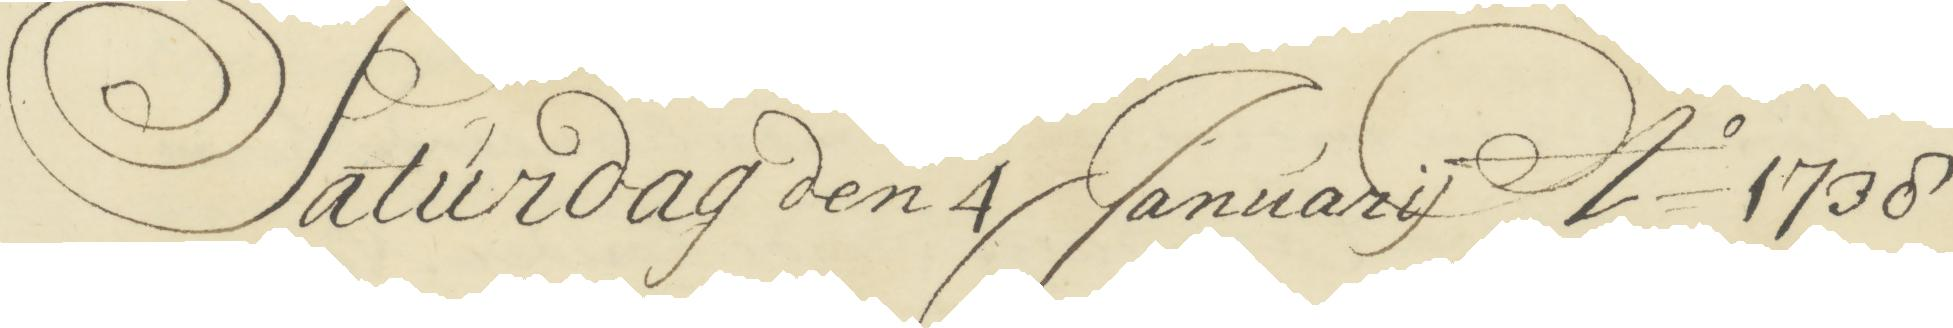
Saturdag den 4 Januarij A=o 1738
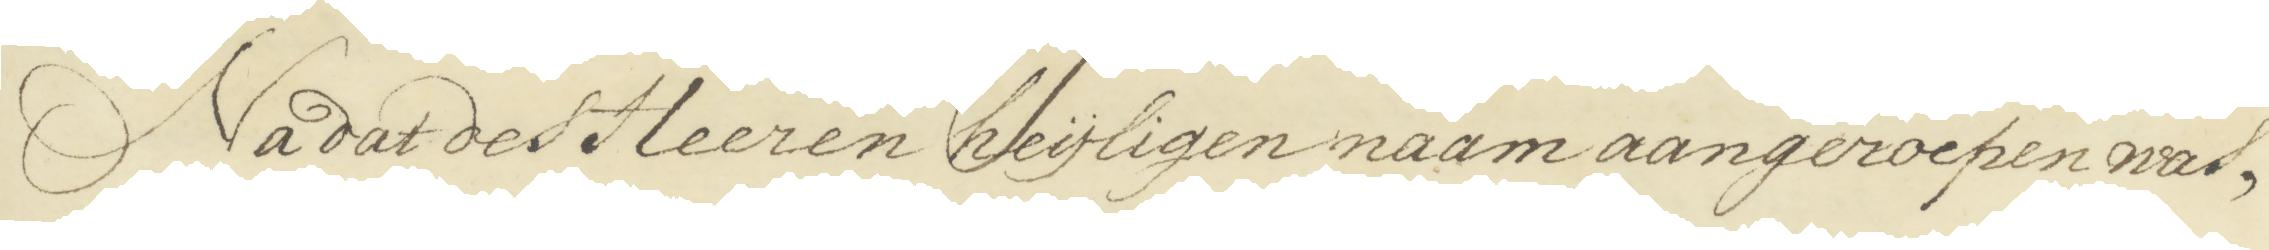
Na dat des Heeren heijligen naam aangeroepen was,
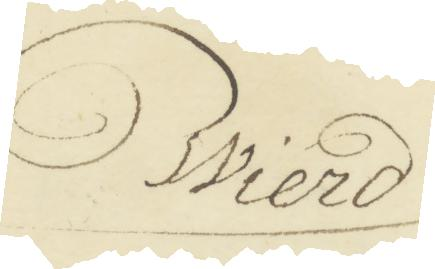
Wierd
